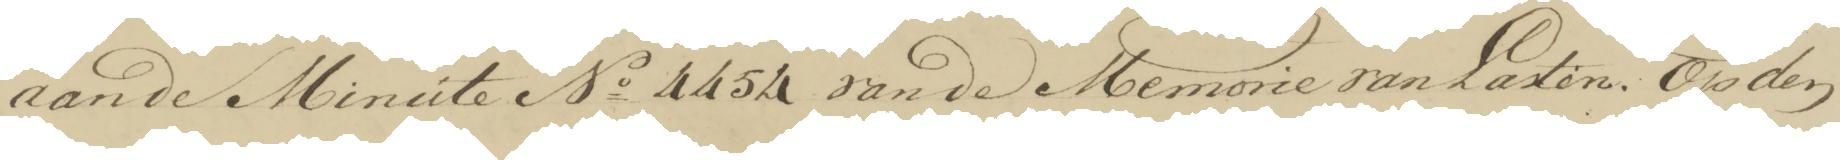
aan de Minute N=o 4454 van de Memorie van Lasten. Op den
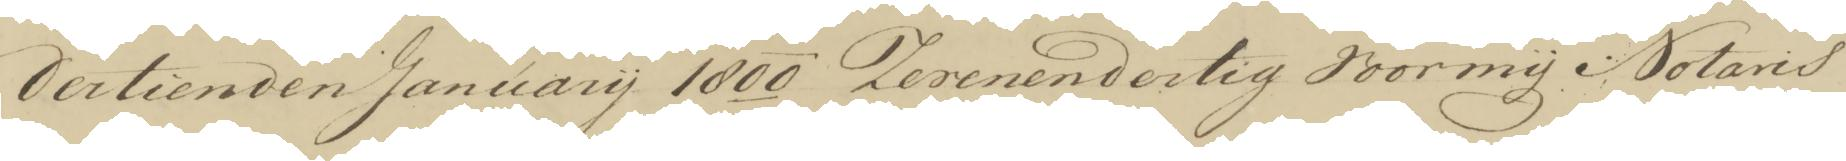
dertienden Januarij 1800 Zevenendertig voor mij Notaris
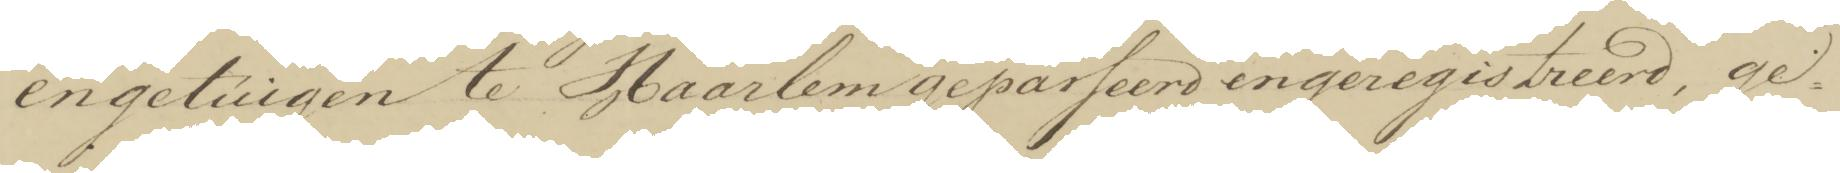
en getuigen te Haarlem gepasseerd en geregistreerd, ge=
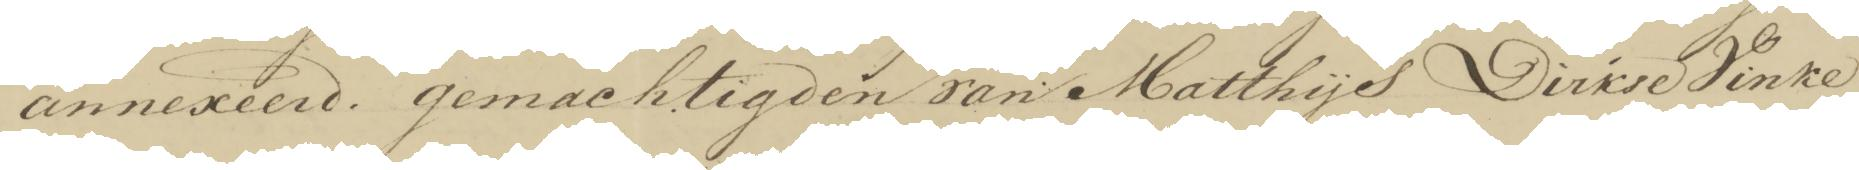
annexeerd. gemachtigden van Matthijs Dirkse Vinke
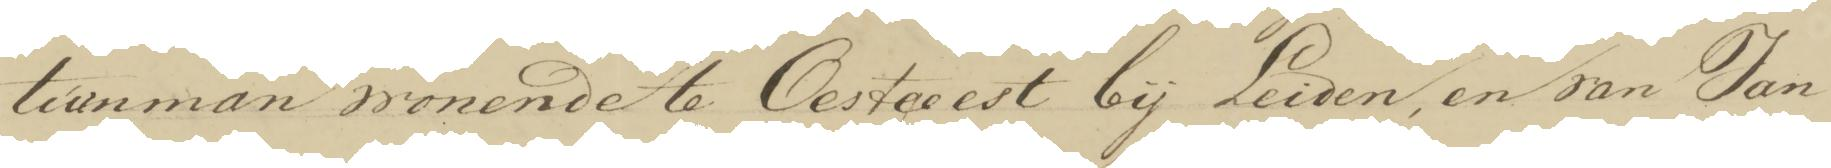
tuinman wonende te Oestgeest bij Leiden, en van Ian
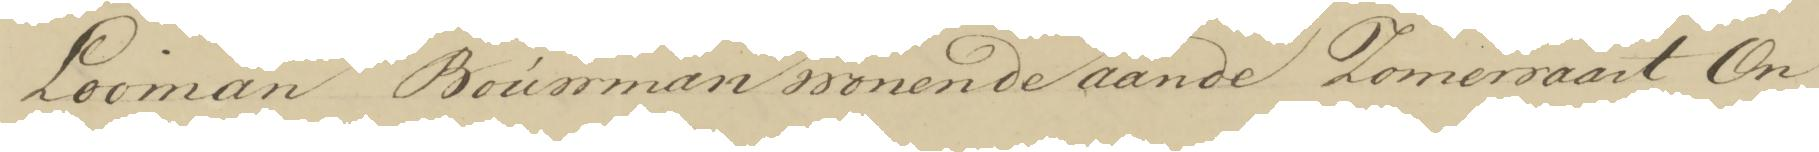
Looman Bouwman wonende aande Zomervaart On
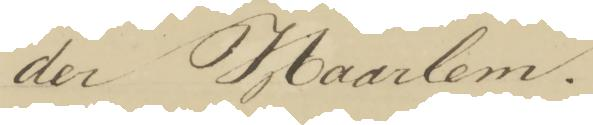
der Haarlem.
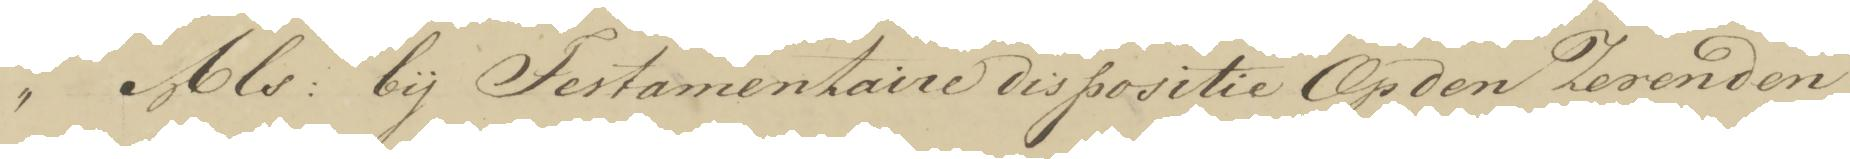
„ Als: bij Testamentaire dispositie Op den Zevenden
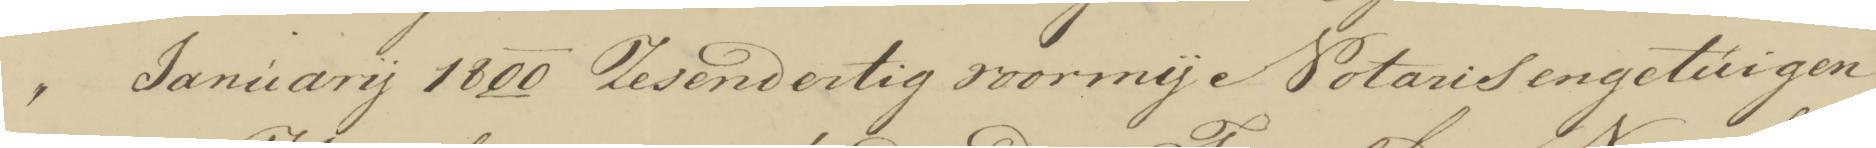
„ Ianuarij 1800 Zesendertig voormij Notaris engetuigen
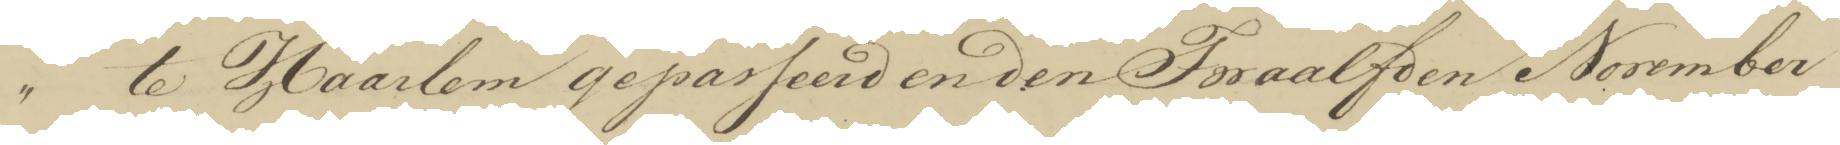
„ te Haarlem gepasseerd en den Twaalfden November
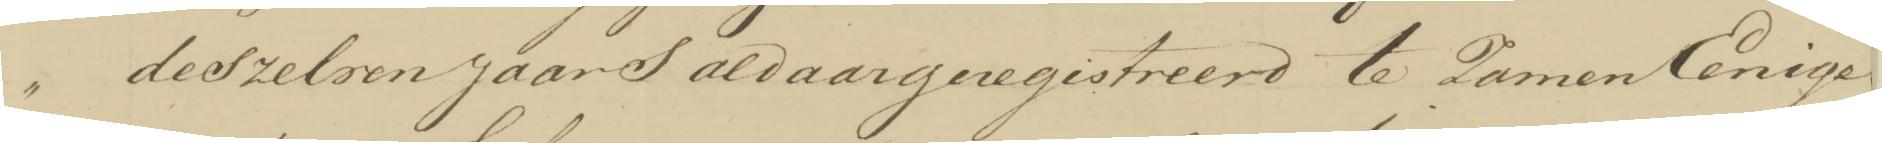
„ deszelven jaars aldaar geregistreerd te Zamen Eenige
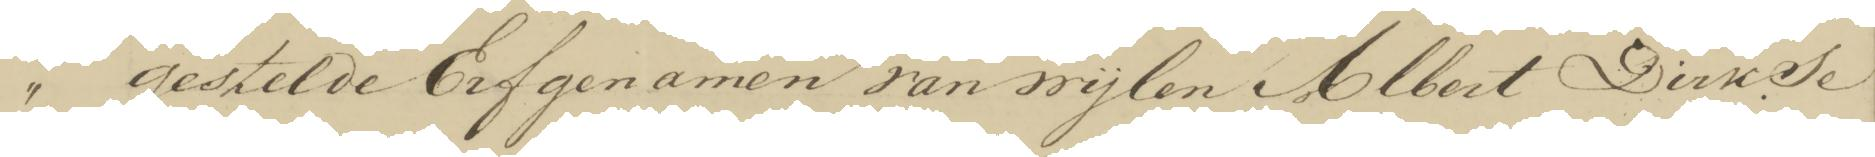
„ gestelde Erfgenamen van wijlen Albert Dirkse
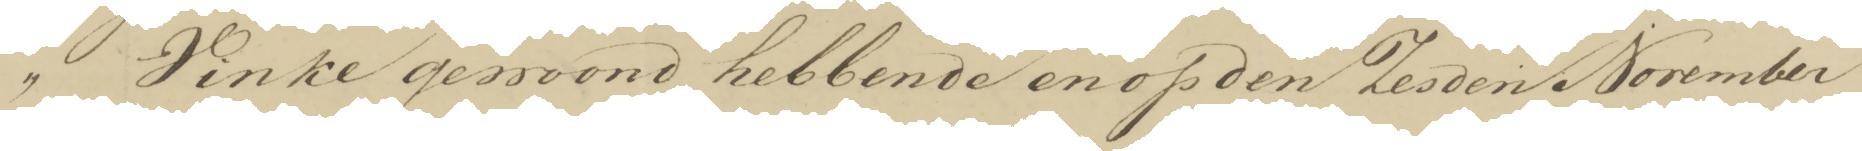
„ Vinke gewoond hebbende en op den Zesden November
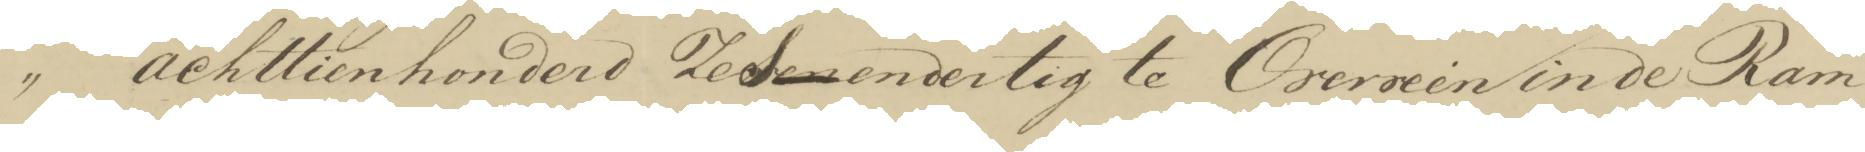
„ achttienhonderd Zesenendertig te Overveen in de Ram
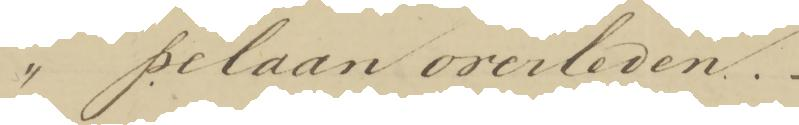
„ pelaan overleden.
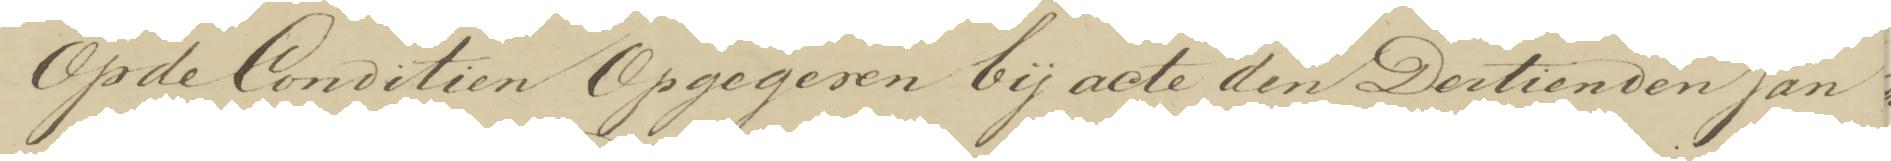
Op de Conditien Opgegeven bij acte den Dertienden Jan
